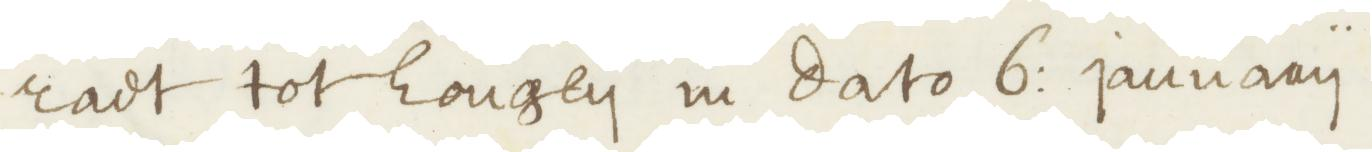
raet tothouglij in dato 6: Januarij
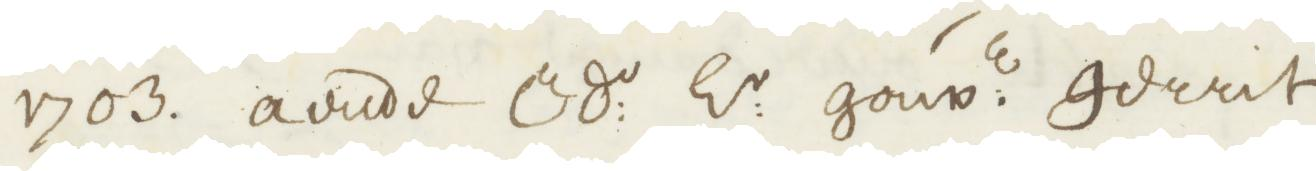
1703. aende Ed:o h:r gouv:' gerrit
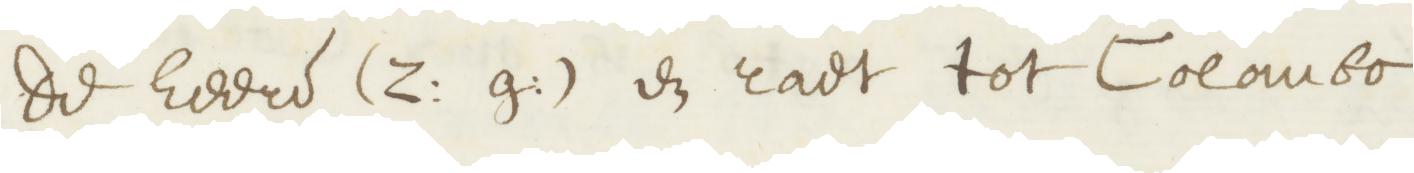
de heere (Z: g:) en raet tot Colombo
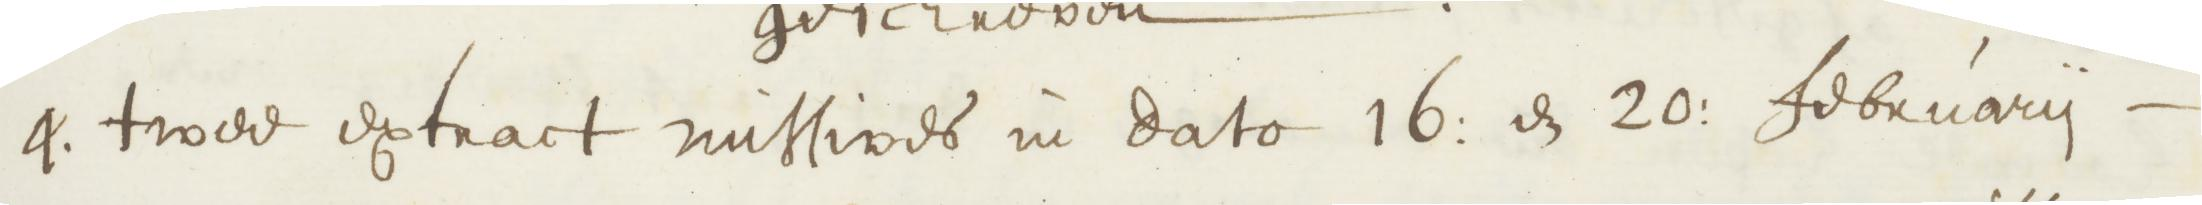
4. twee extract missives in dato 16: en 20: februarij —
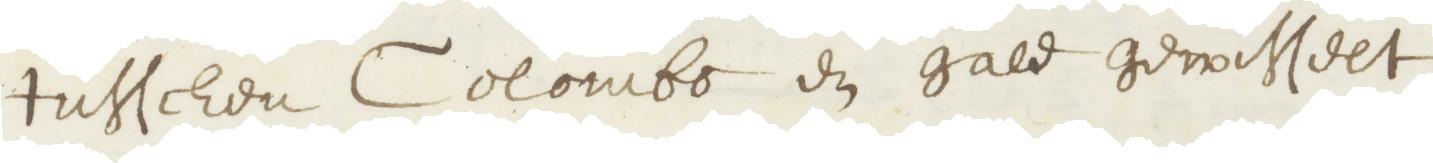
tusschen Colombo en gale gewisselt
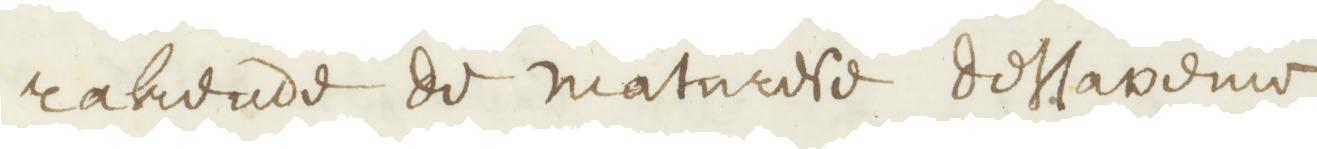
rakende de maturese dessavenie
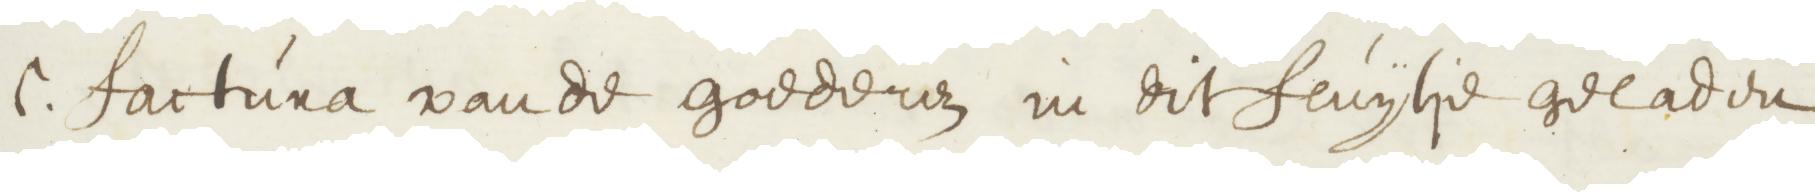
5. factura van de goederen in ditfluijtje geladen
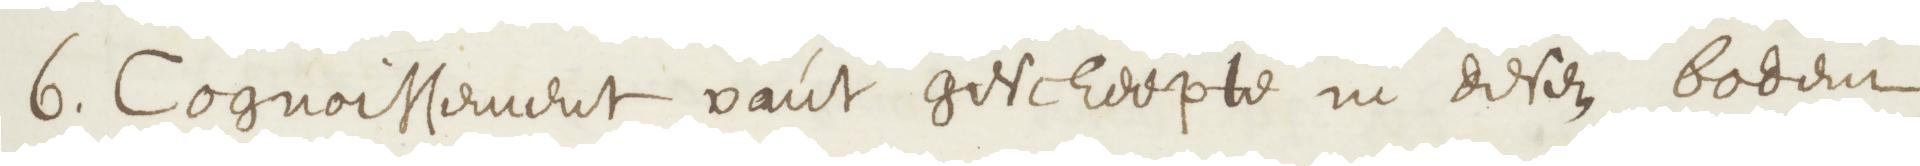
6. Cognoissement van’t gescheepte in desen bodem
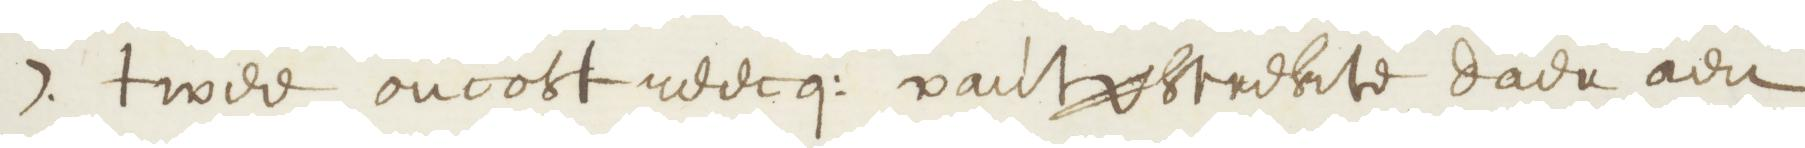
7. twee oncost reecq: van ’tverstrekte daer aen
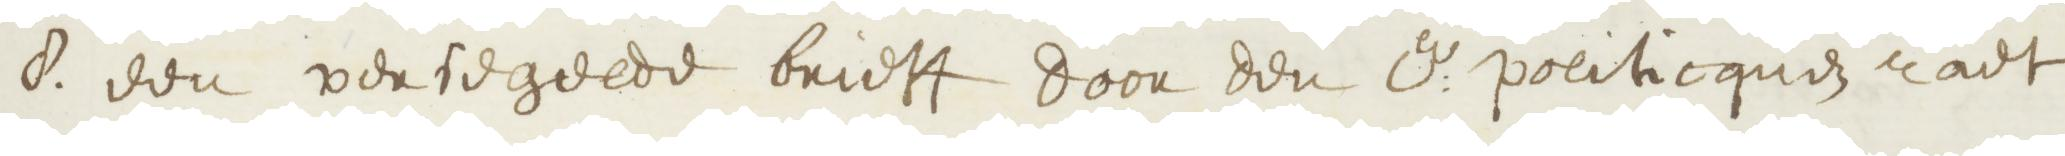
8. een versegelde brieff door den E: politicquen raet
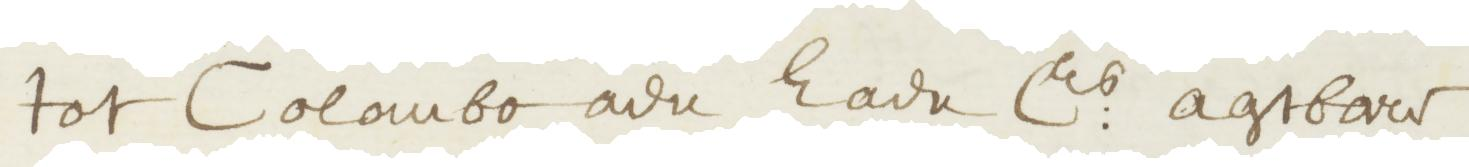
tot Colombo aen haer E:s agtbare
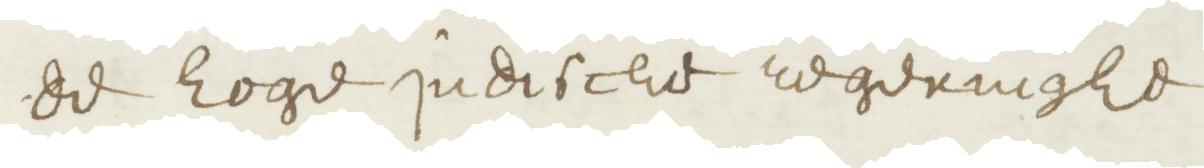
de hoge jndische regeringhe
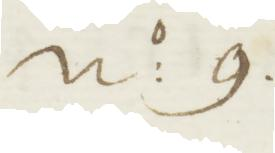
n:o 9.
